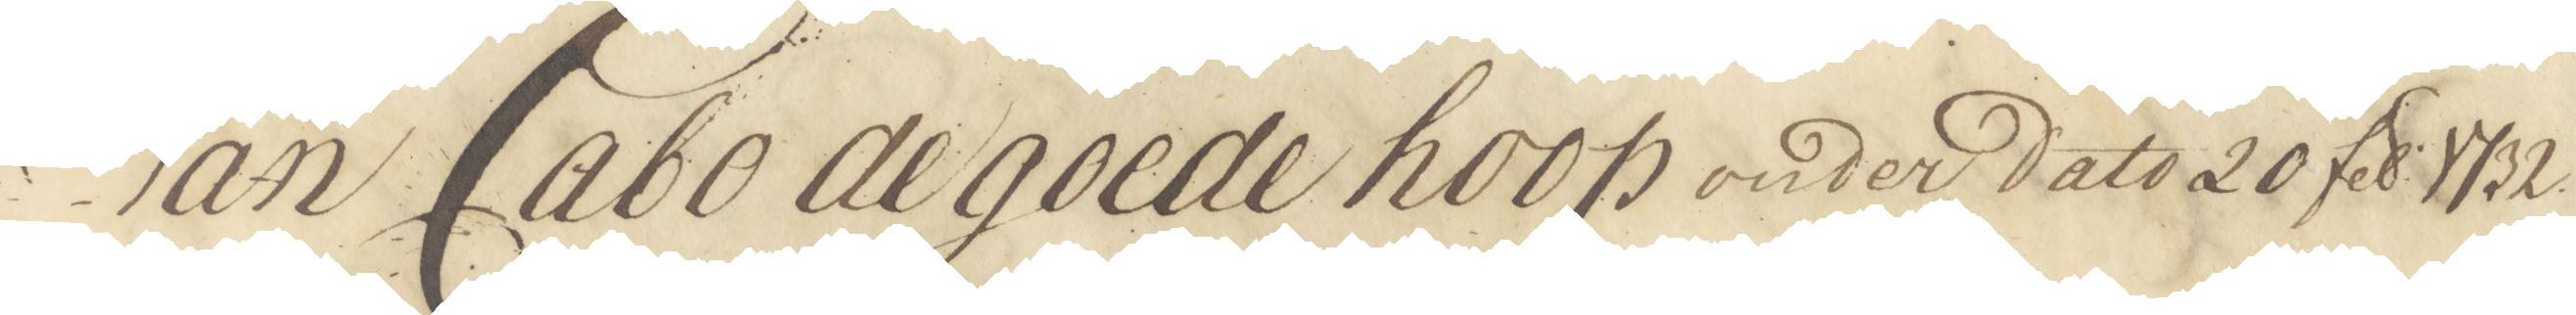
Van Cabo de goede hoop onder dato 20 feb: 1732.
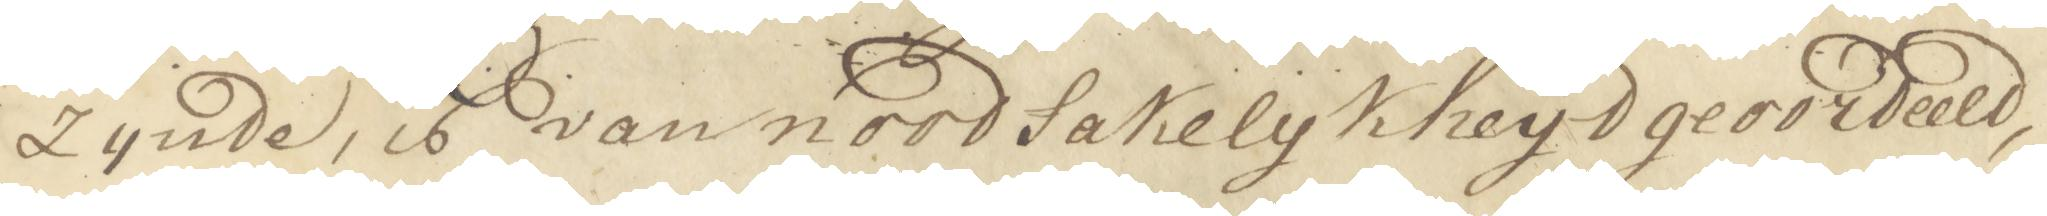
zijnde, is van noodsakelijkheijd geoordeeld,
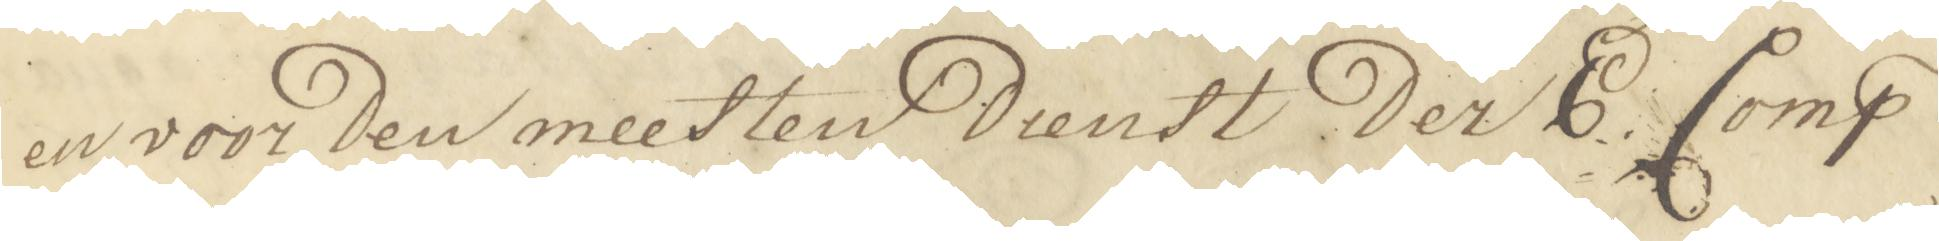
en voor den meesten dienst der E: Comp
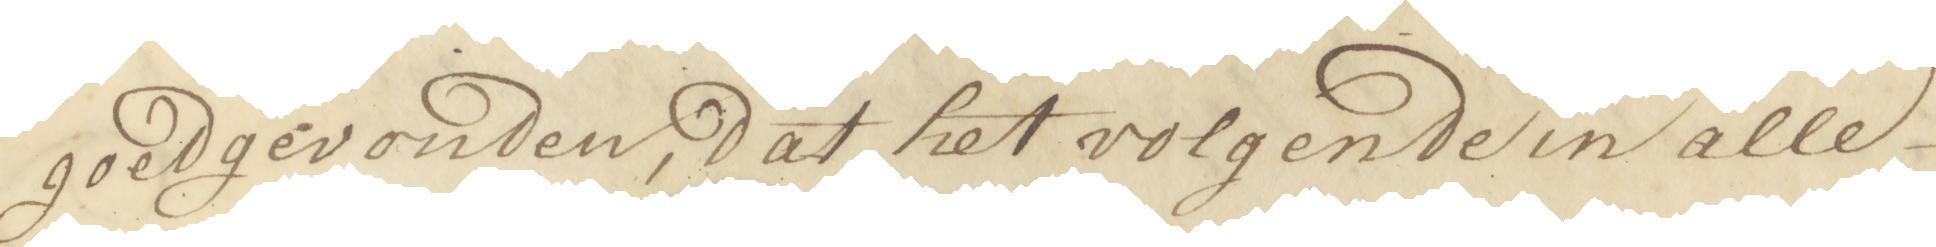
goedgevonden, dat het volgende in alle
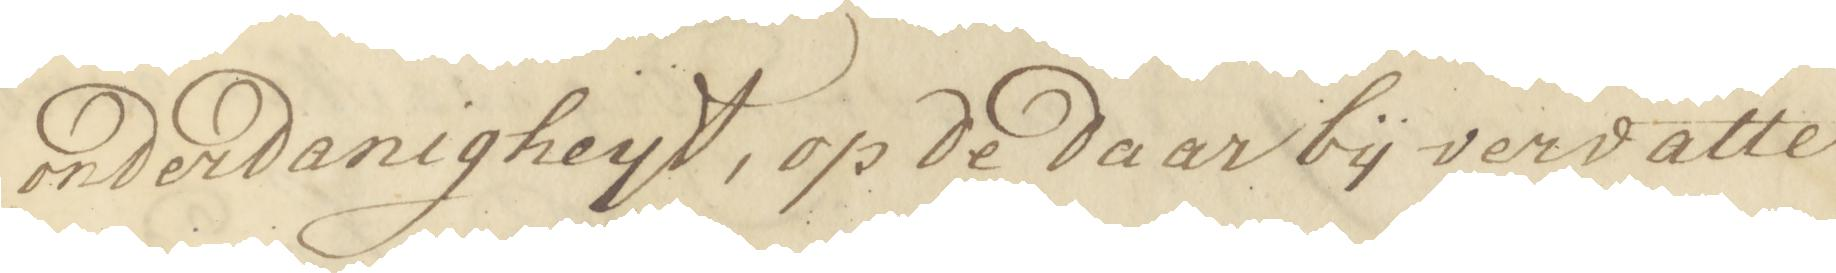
onderdanigheijt, op de daar bij vervatte
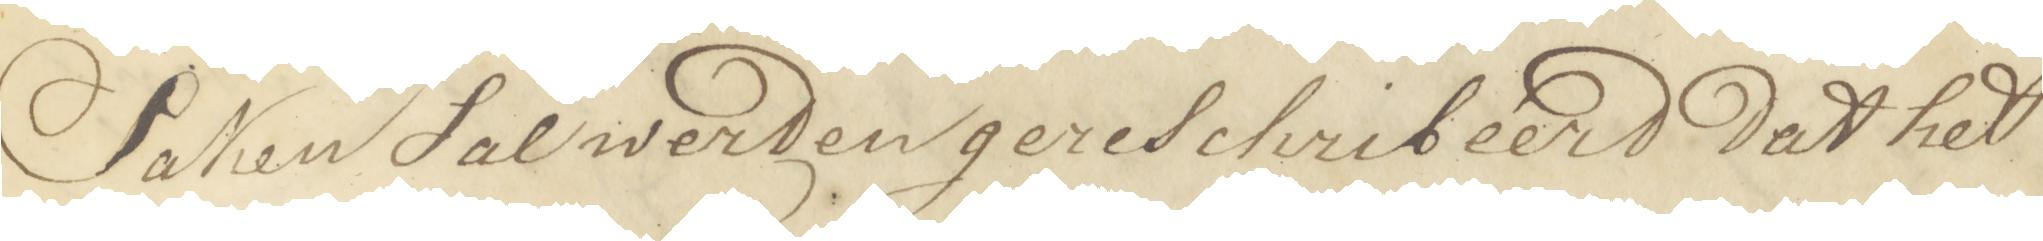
saken sal werden gereschribeerd dat het
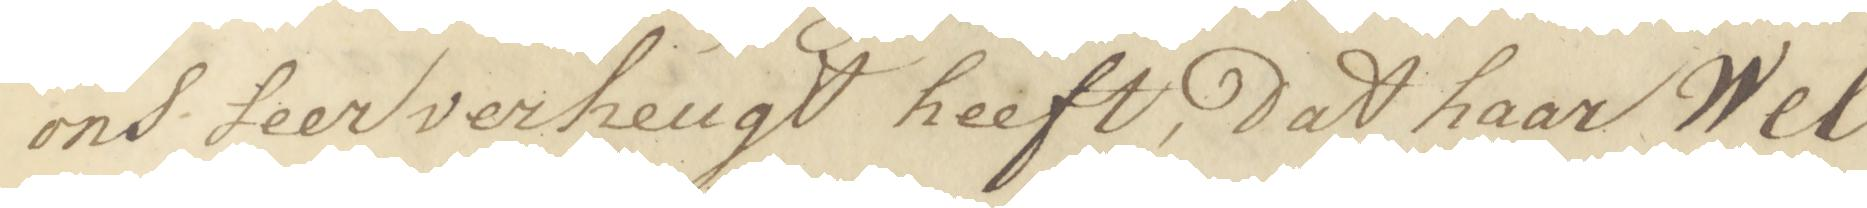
ons seer verheugt heeft, dat haar wel
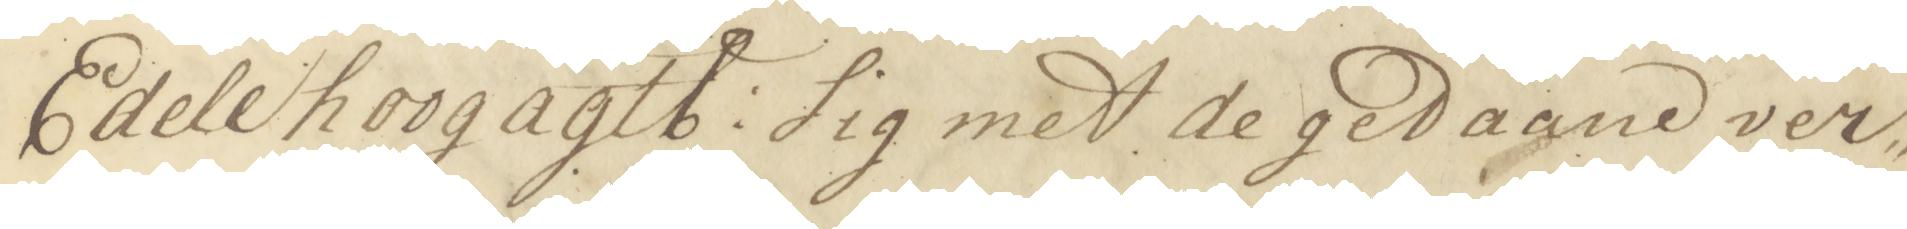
Edele hoog agtb: sig met de gedaane ver„
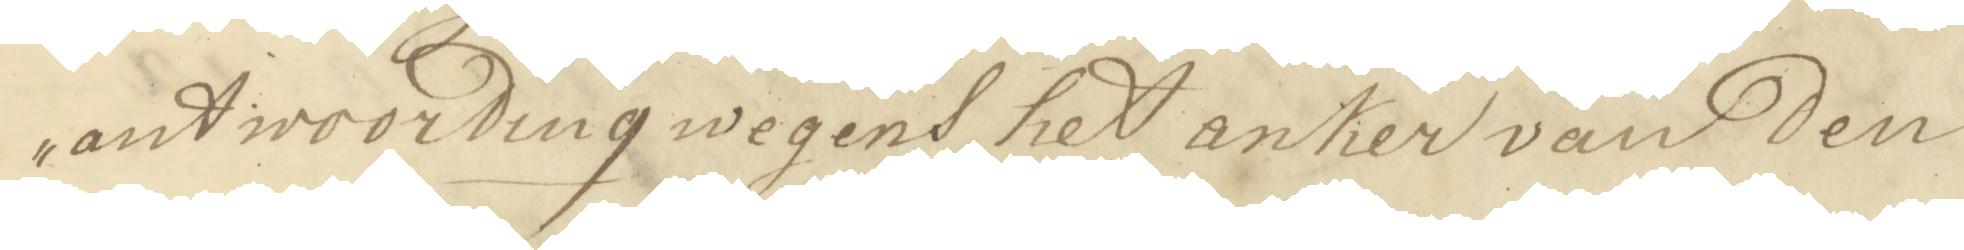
„antwoording wegens het anker van den
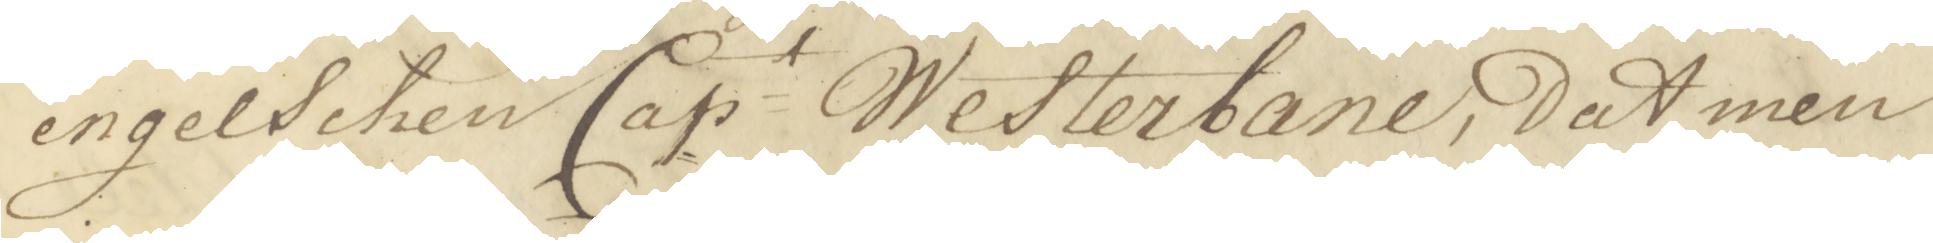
engelschen Cap=t Westerbane, dat men
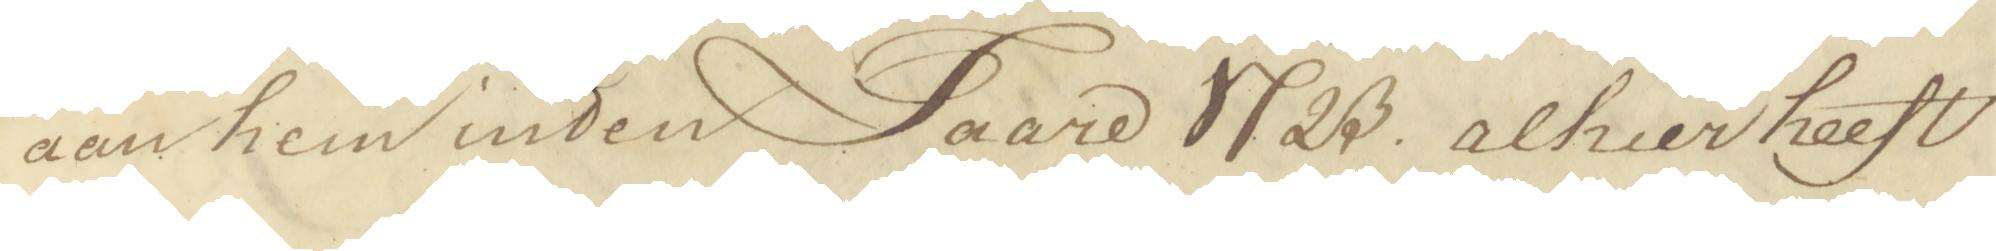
aan hem inden Iaare 1723. alhier heeft
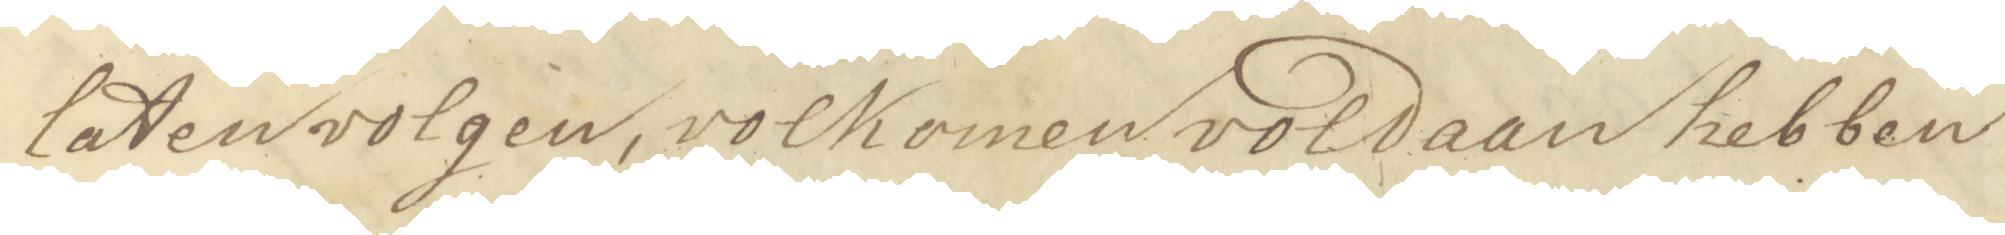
laten volgen, volkomen voldaan hebben
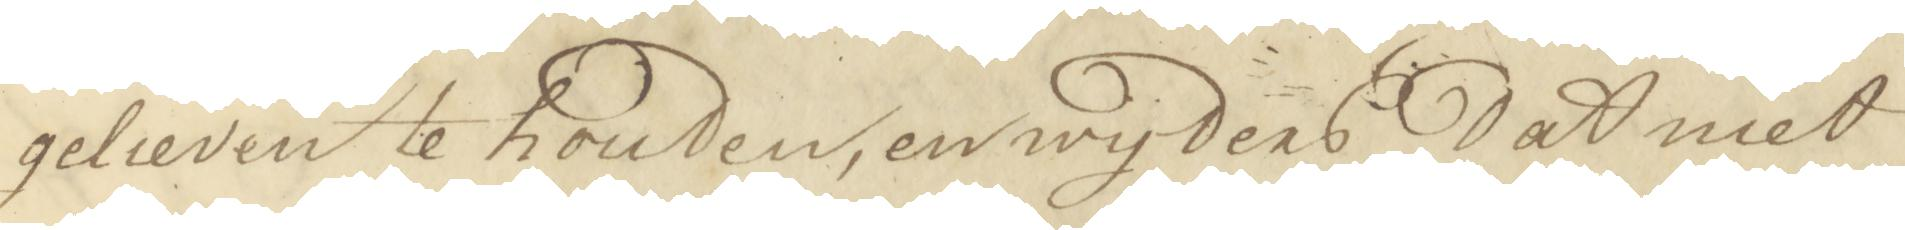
gelieven te houden, en wijders dat met
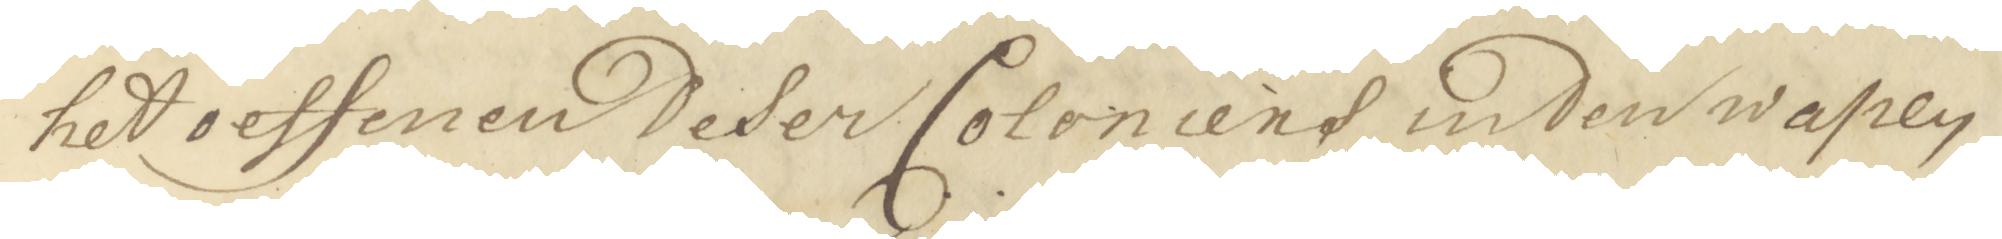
het oeffenen deser Coloniers in den wapen
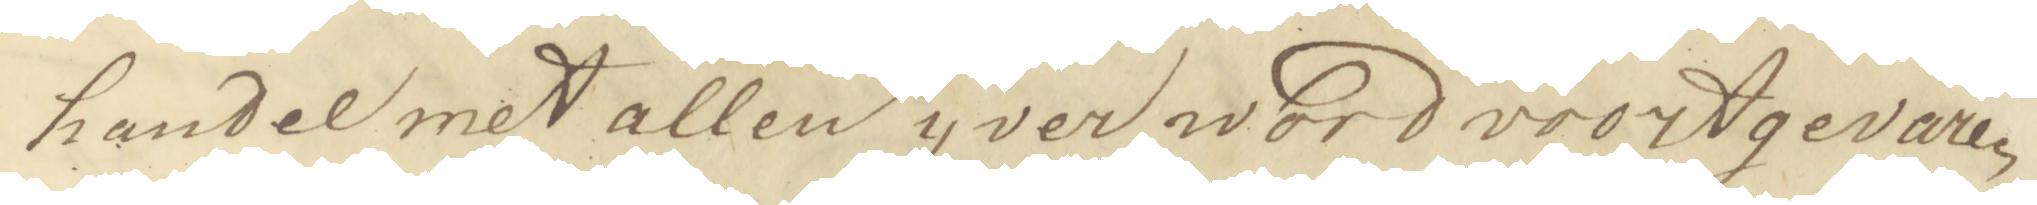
handel met allen ijver word voortgevaren,
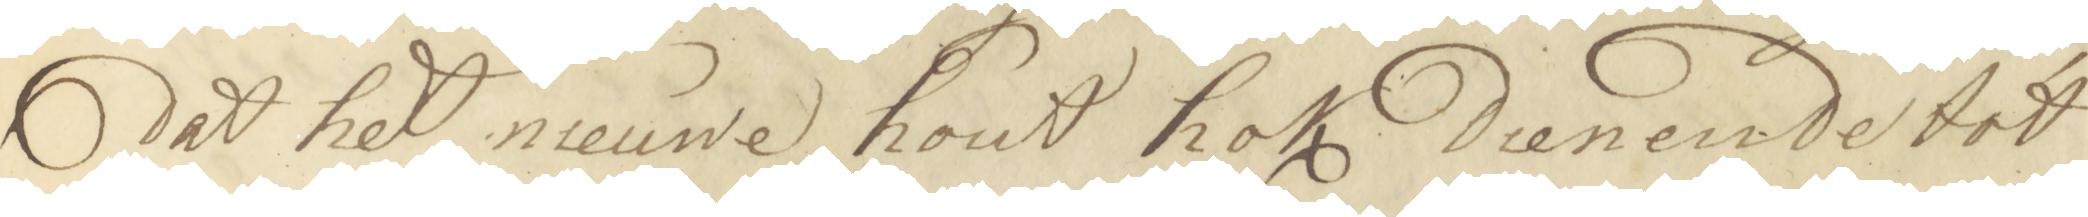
dat het nieuwe hout hok dienen de tot
